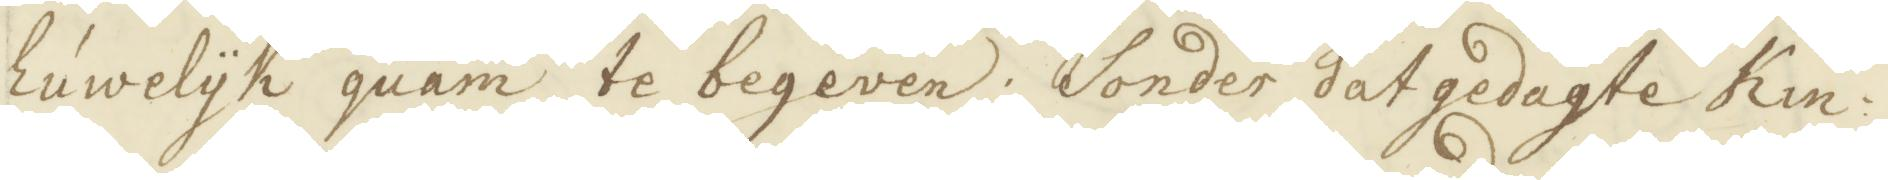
huwelijk quam te begeven; sonder dat gedagte kin=
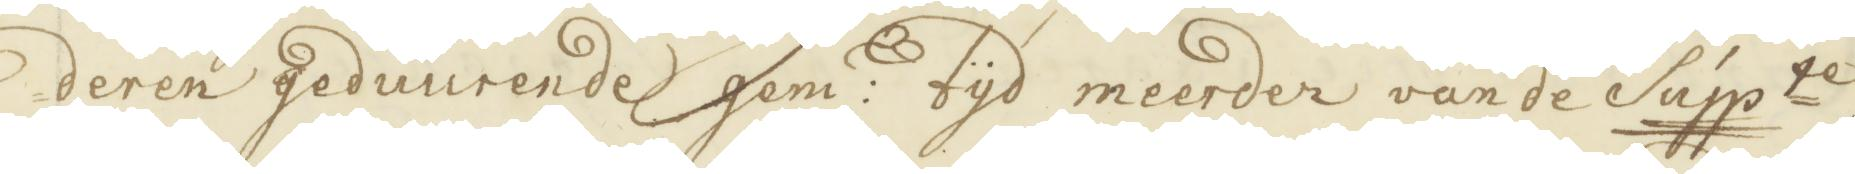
=deren geduurende gem: tijd meerder van de supp=te
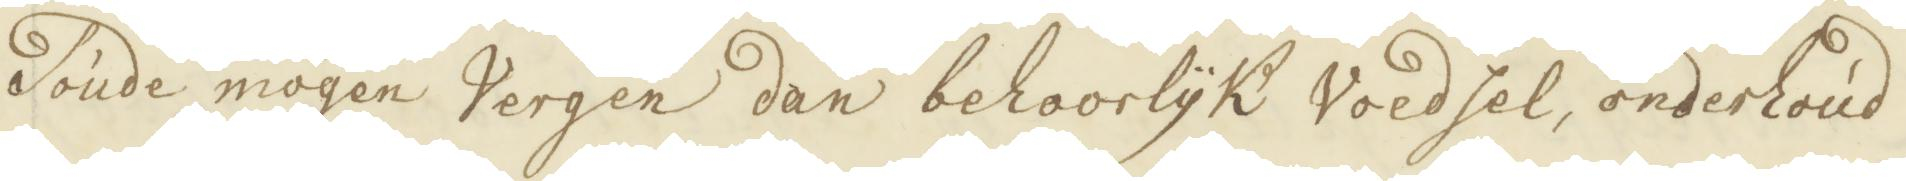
soude mogen vergen dan behoorlijk voedsel, onderhoud
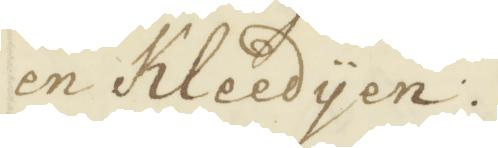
en kleedijen.
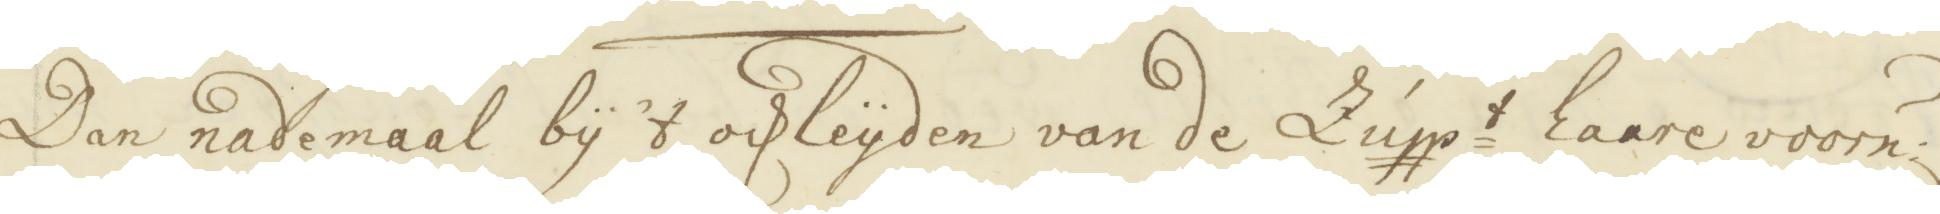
Dan nademaal bij ’t overleijden van de zupp=t haare voorn:
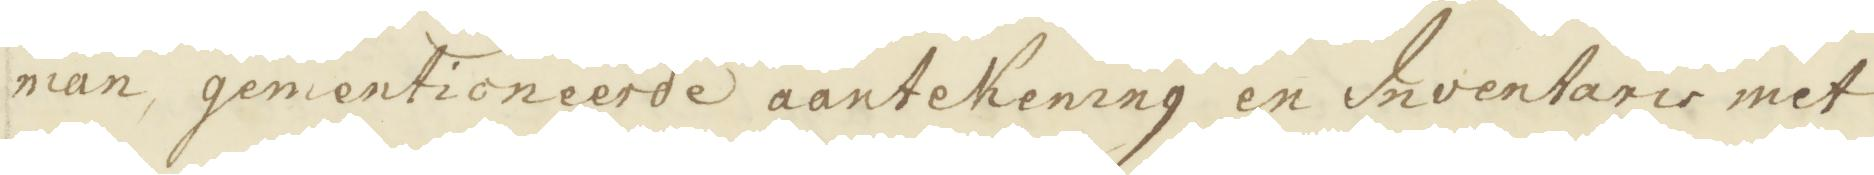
man, gementioneerde aantekening en jnventaris met
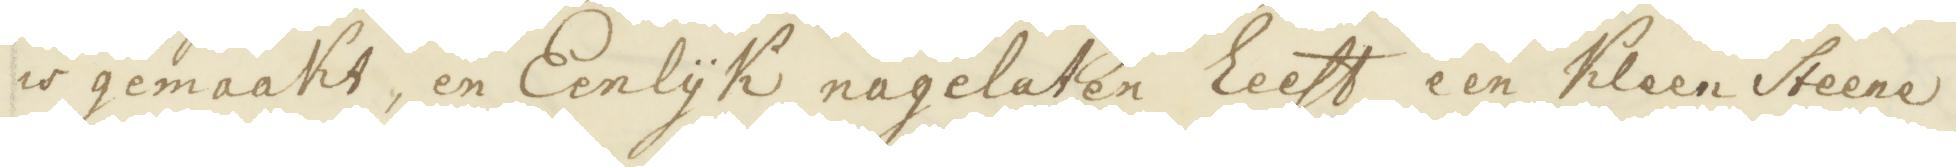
is gemaakt, en Eenlijk nagelaten heeft een kleen steene
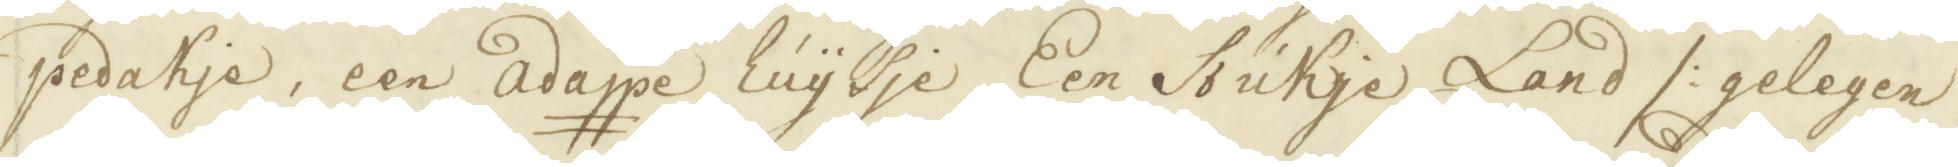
pedakje, een adappe huijsje, Een stukje land /: gelegen
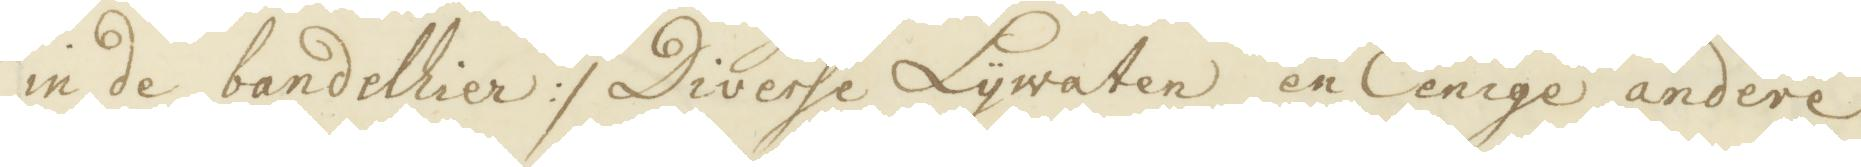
in de bandelhier :/ Diverse lijwaten, en Eenige andere
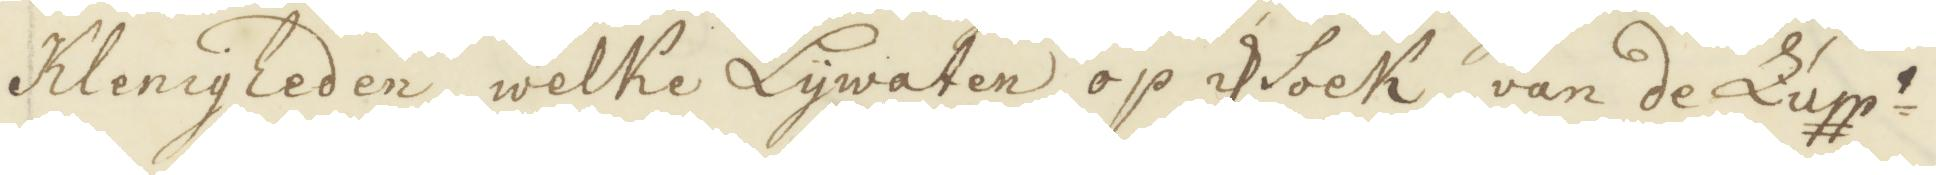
klenigheden, welke lijwaten op vesoek van de zupp=t
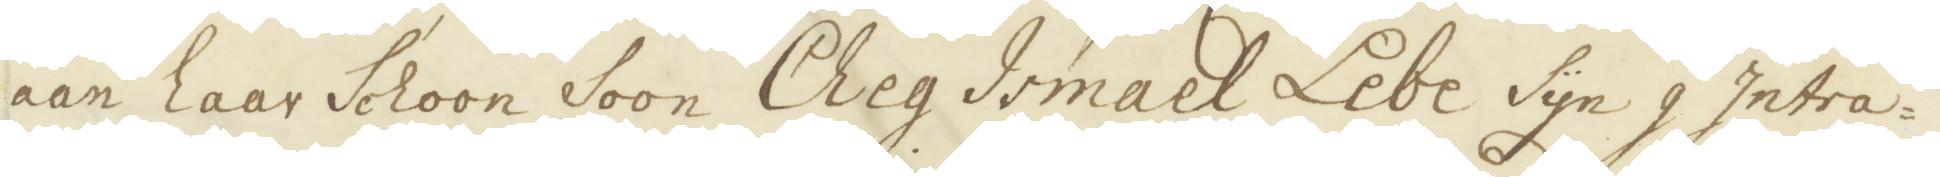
aan haar schoon soon Cheg Jsmael Lebe sijn g'jntra=
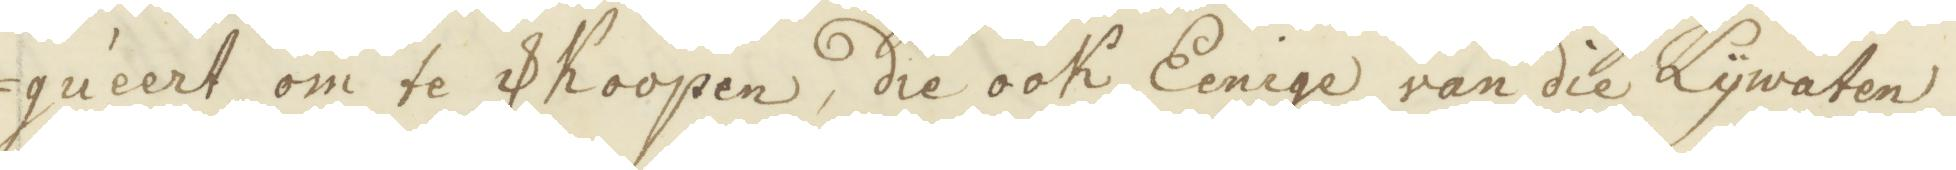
=gueert om te verkoopen, die ook Eenige van die lijwaten
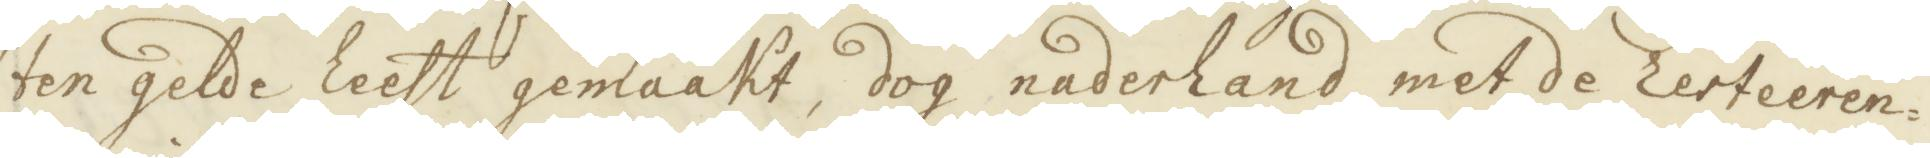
ten gelde heeft gemaakt, dog naderhand met de resteeren=
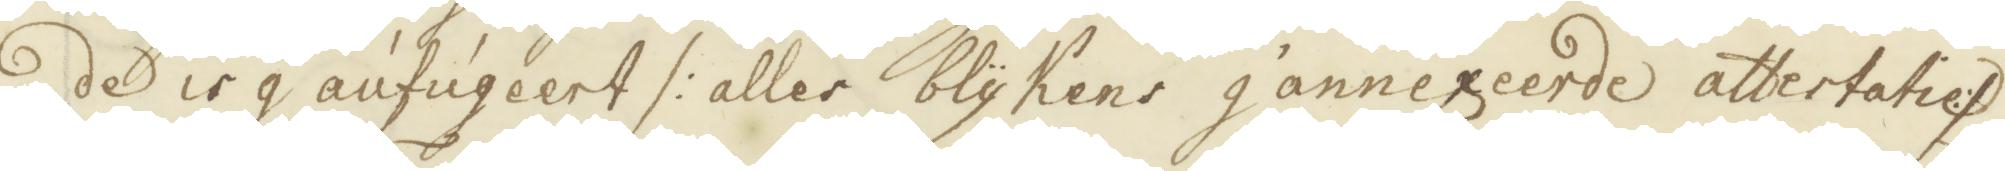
=de is g’aufugeert /: alles blijkens g'annexeerde attestaties
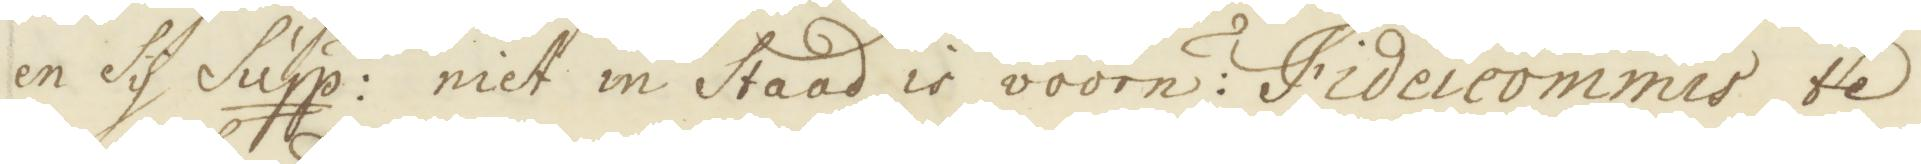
en sij supp: niet in staad is voorn: Fideicommis te
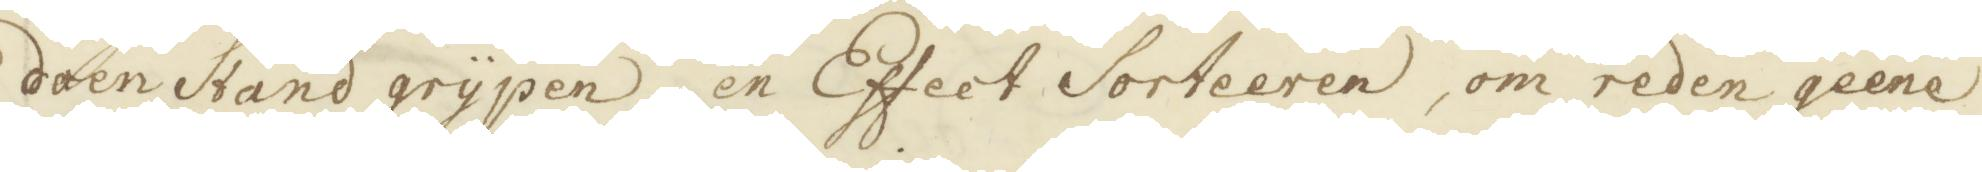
doen stand grijpen, en Effect sorteeren, om reden geene
